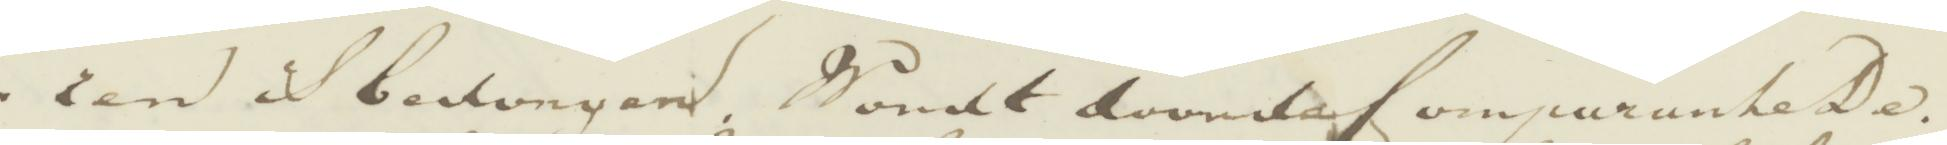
ren is bedongen, Wordt door de Comparante De„
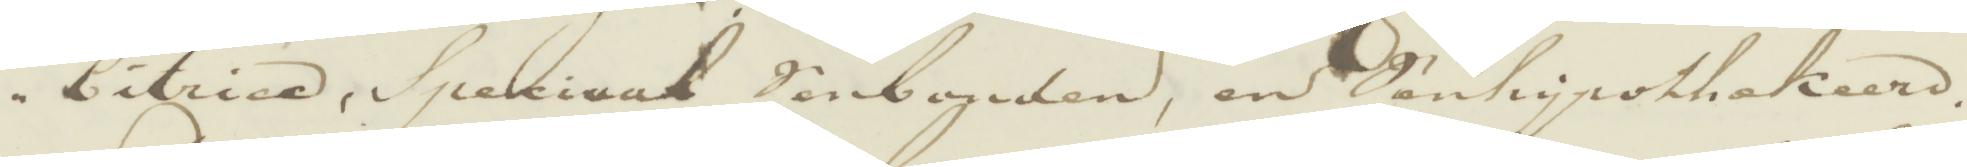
„bitrice, speciaal verbonden, en verhijpothekeerd.
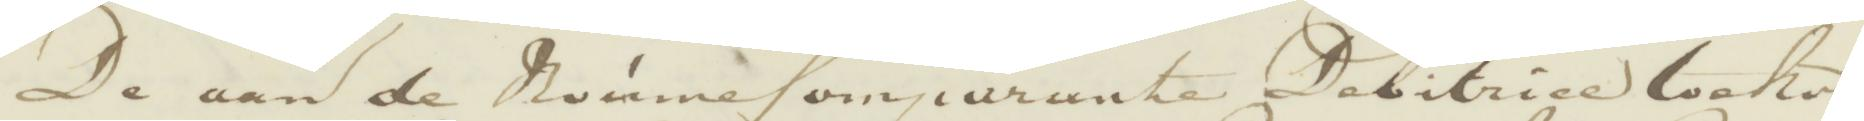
De aan de Vrouwe Comparante Debitrice toeko
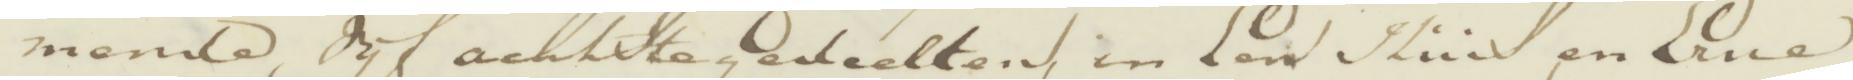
mende vijf achtste gedeelten, in Een Huis en Erve
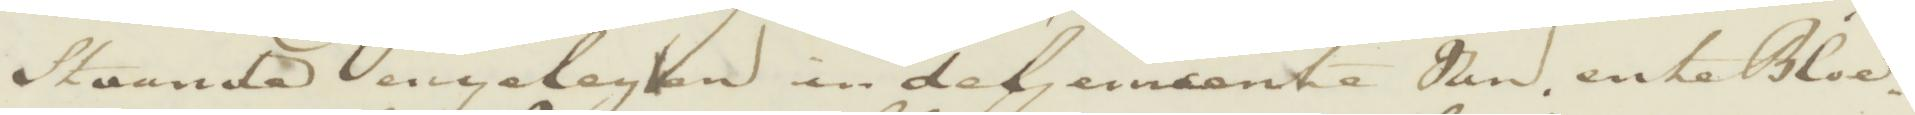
staande engelegen in de Gemeente van, en te Bloe„
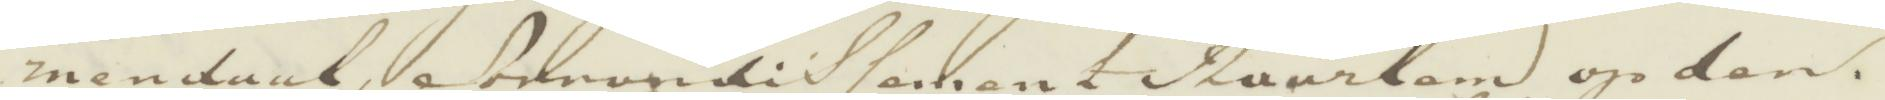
mendaal, Arrondissement Haarlem, op den
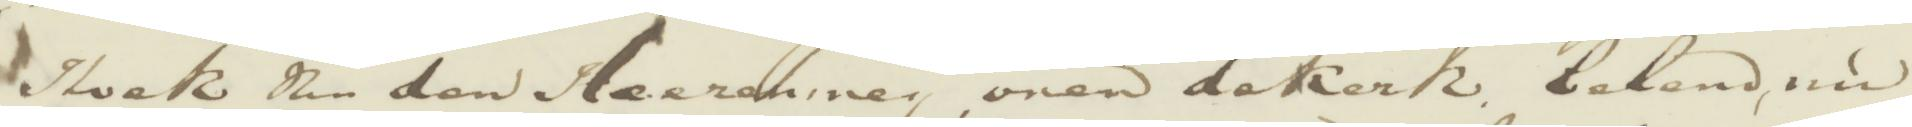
Hoek van den Heerenweg, over de kerk, belend, nu,
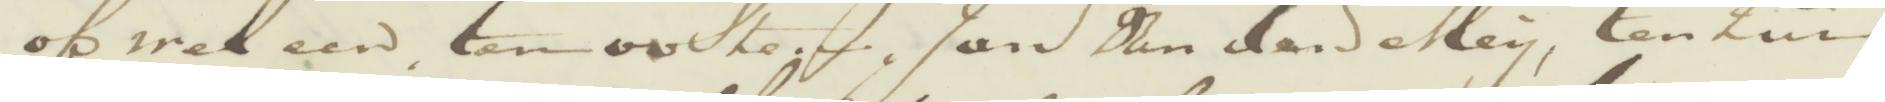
of wel eer, ten oosten Jan van der Meij, ten zui
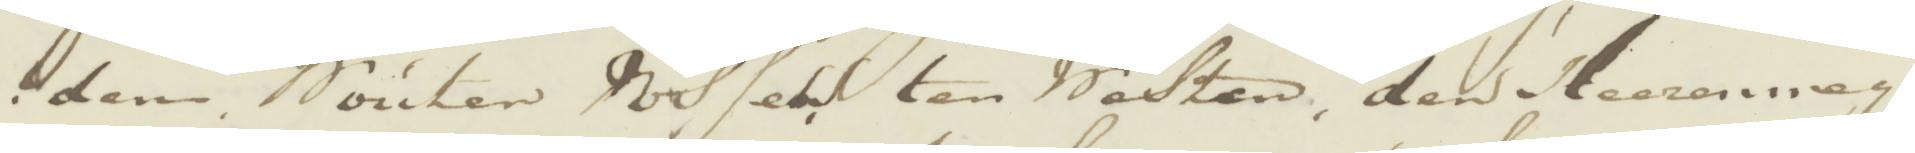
den Wouter Vossen, ten Westen, den Heerenweg,
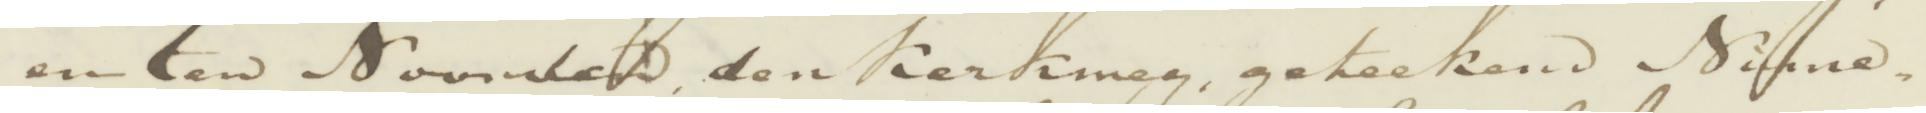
en ten Noorden, den Kerkweg, geteekend Nume„
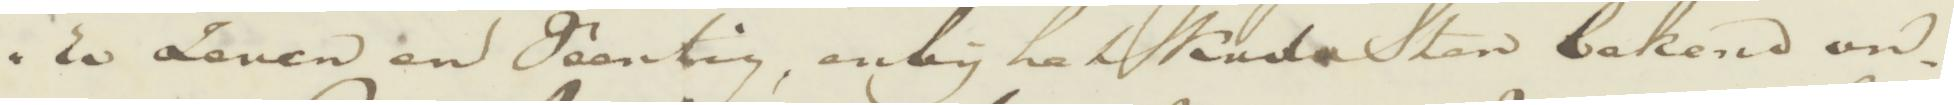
„ro zeven en Veertig, en bij het kadaster bekend on„
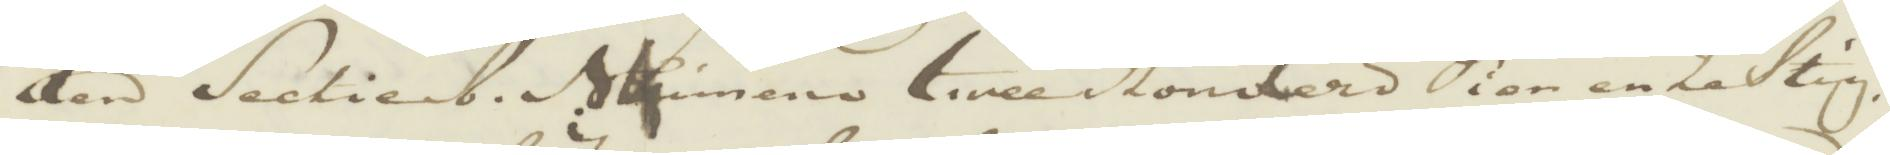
der Sectie A. Numero twee Honderd Vier en zestig
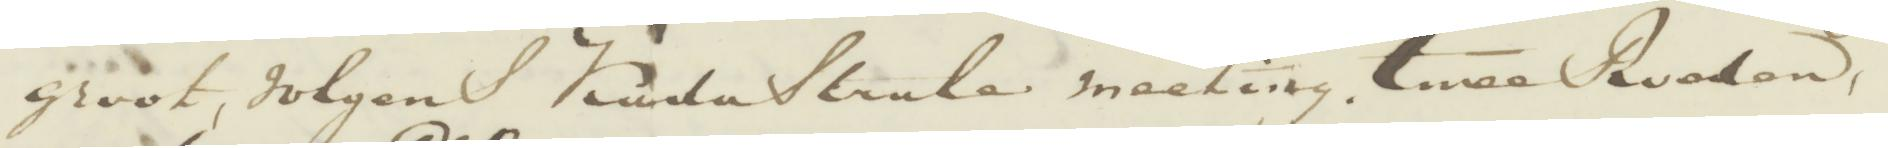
groot, volgens Kadastrale meeting, twee Roeden,
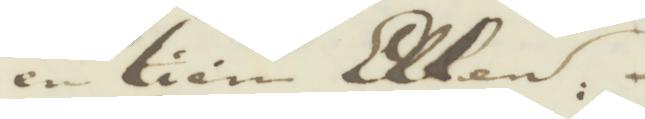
en tien Ellen.
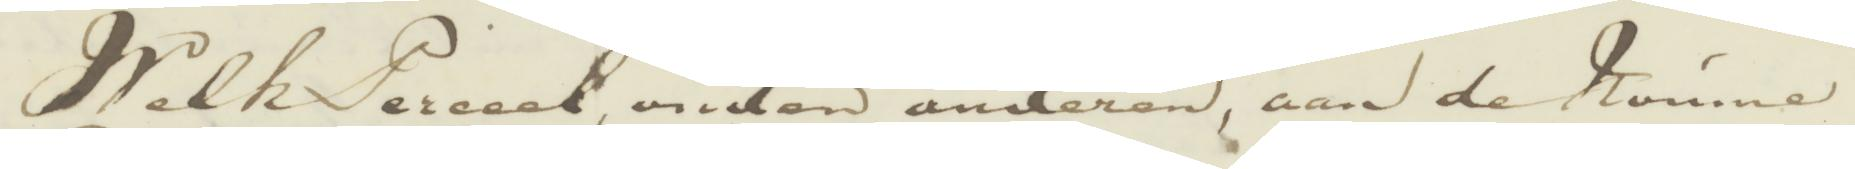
Welk Perceel, onder anderen, aan de Vrouwe
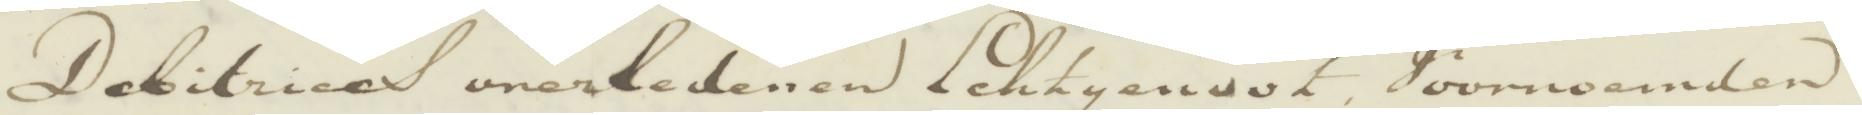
Debitrices overledenen Echtgenoot, voornoemden
